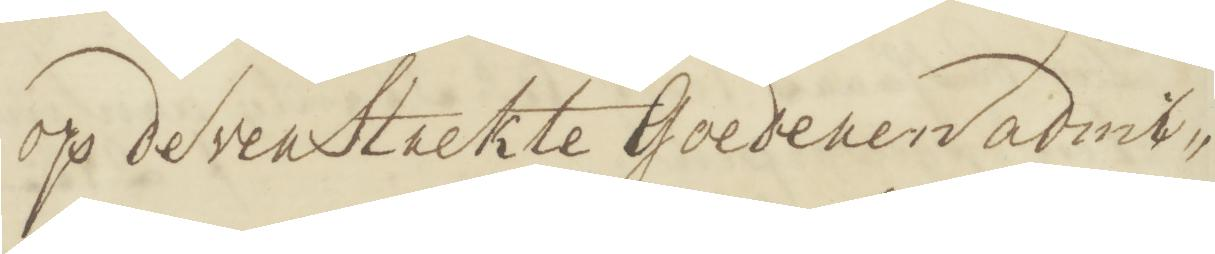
op de verstrekte goederen admi„
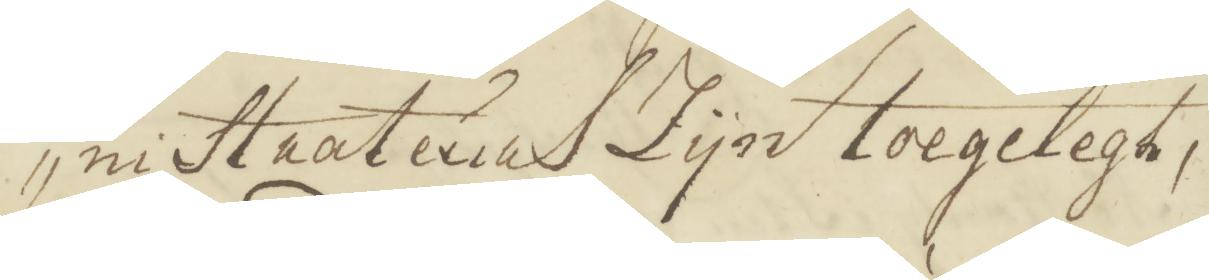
„nistrateurs zijn toegelegt,
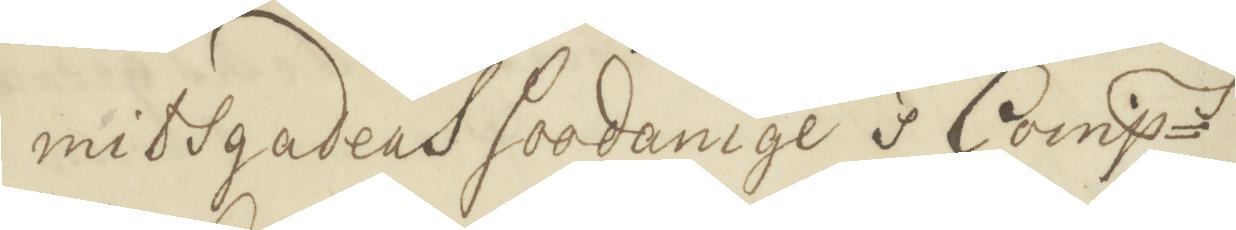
mitsgaders soodanige ’s Comp=s
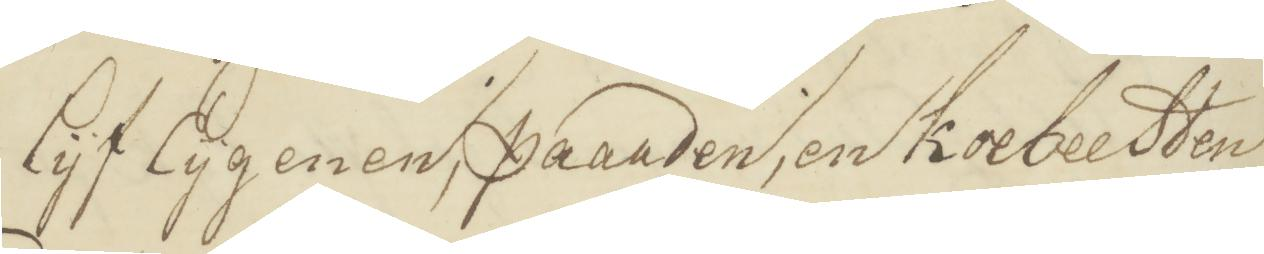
lijf Eijgenen, paarden, en koebeesten
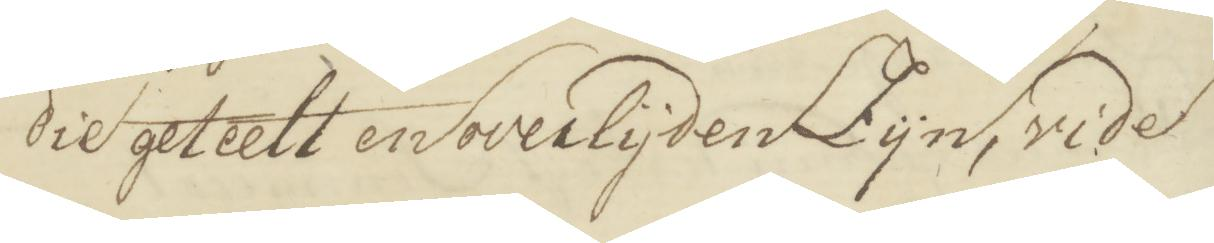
die geteelt en overlijden zijn, vide
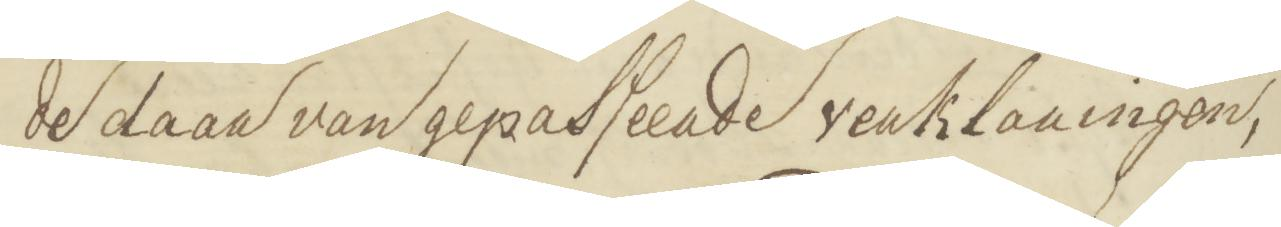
de daar van gepasseerde verklaringen,
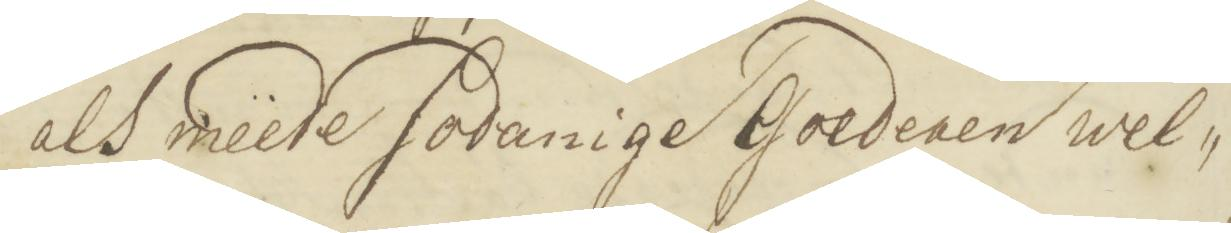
als meede sodanige goederen wel„
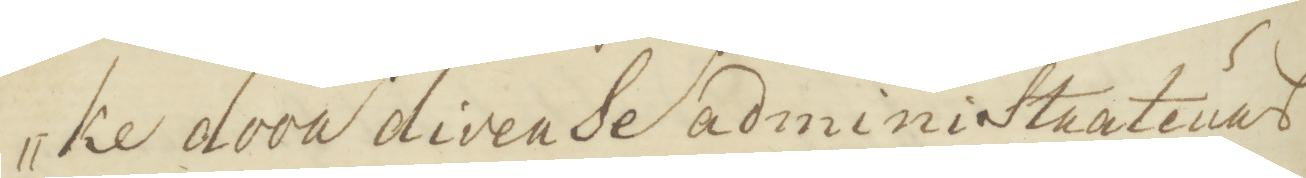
„ke door diverse administrateurs
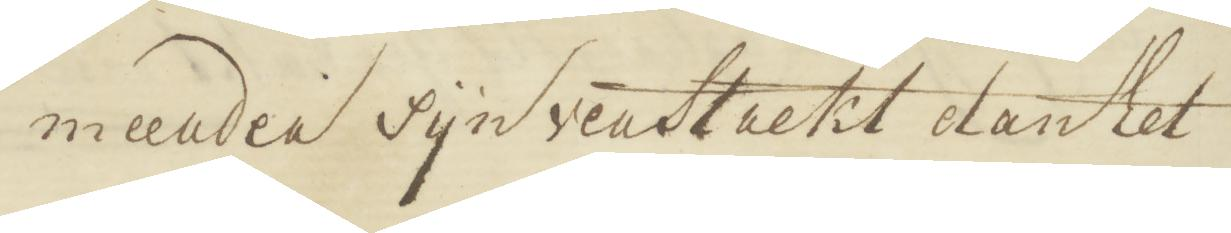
meerder sijn verstrekt dan het
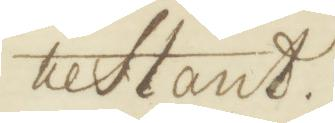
restant.
